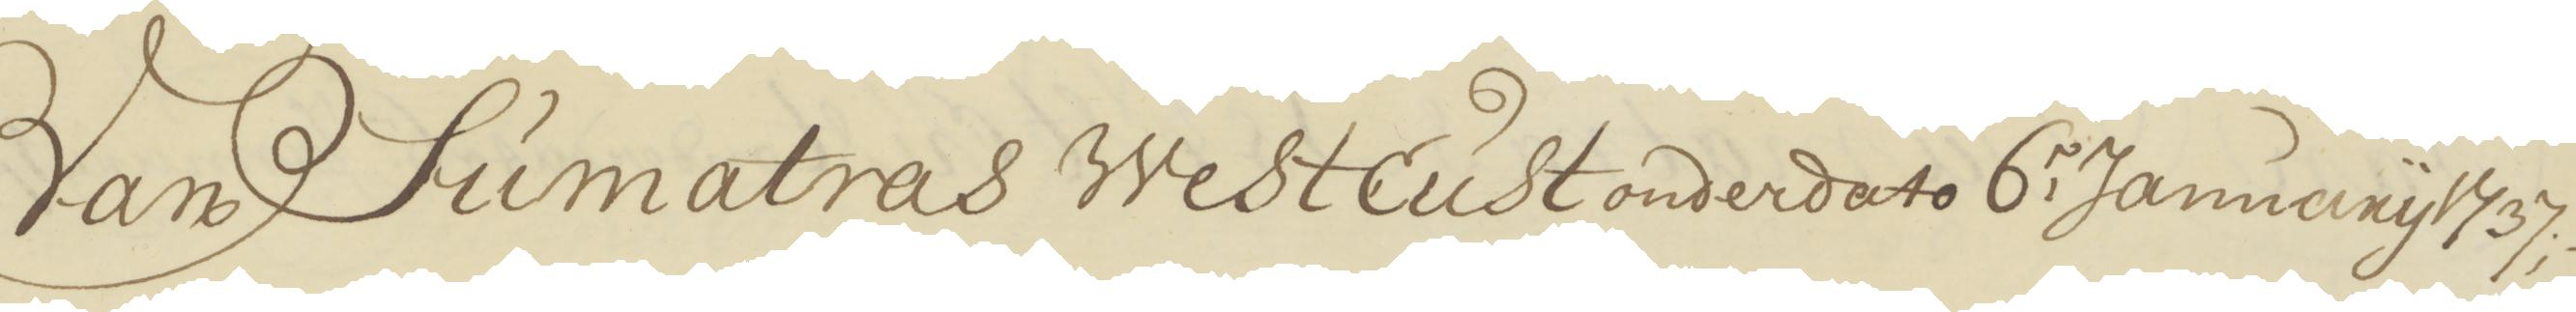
Van Sumatras Westcust onderdato 6:n Januarij 1737;-
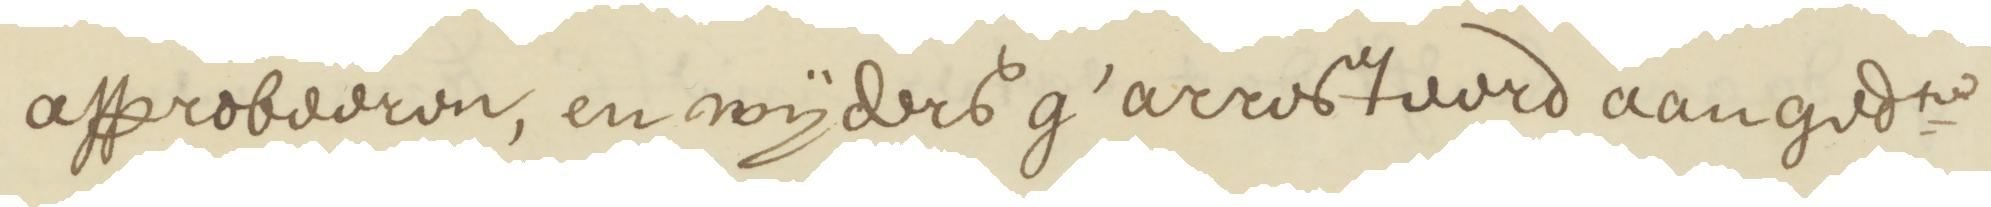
approbeeren, en wijders g’arresteerd aan ged=te
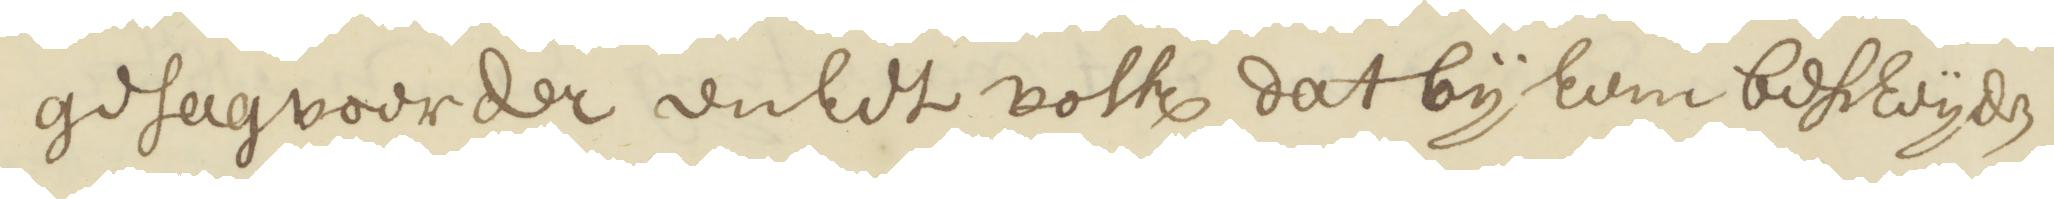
gesagvoerder en het volk dat bij hem bescheijden
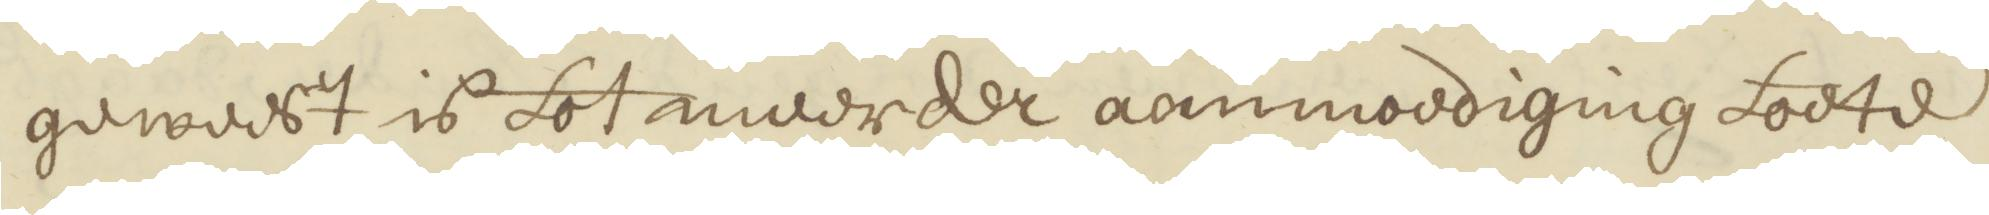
geweest is tot meerder aanmoediging toete
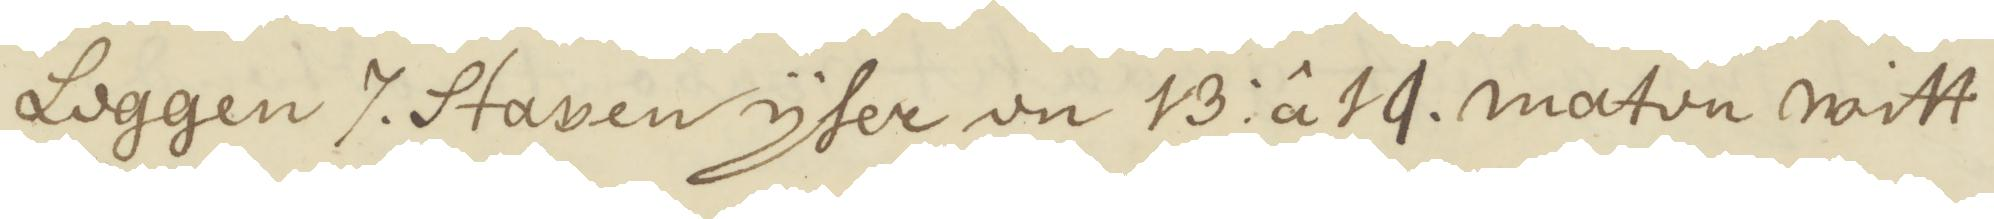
leggen 7. staven ijser en 13: â 14. maten witt
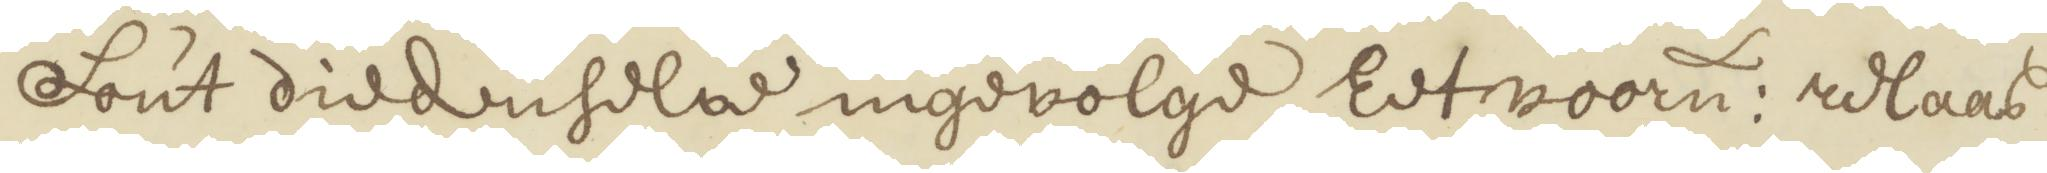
sout die denselve ingevolge het voorn: relaas
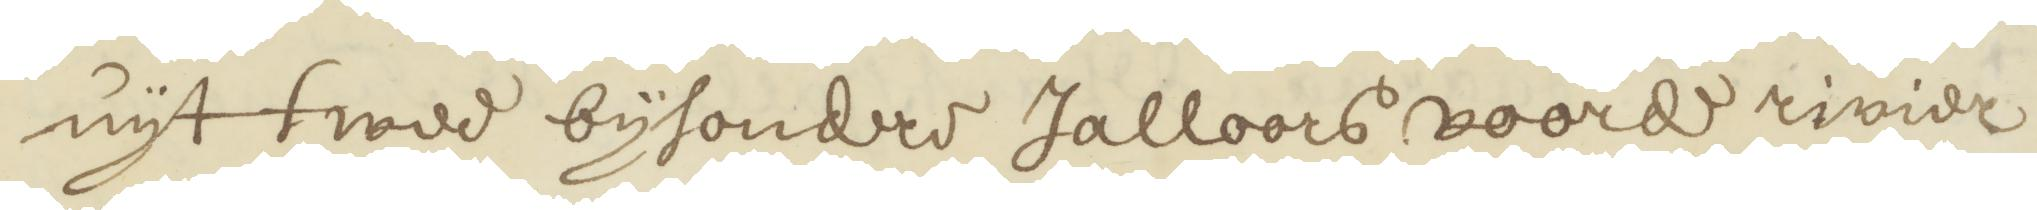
uijt twee bijsondere Jalloors voorde rivier
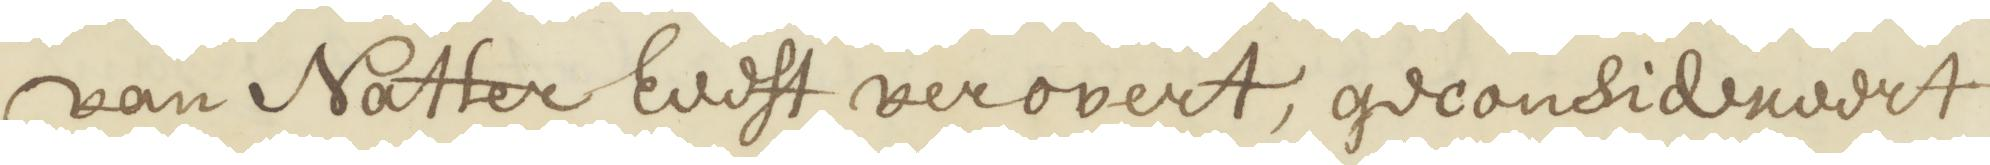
van Natter heeft verovert, geconsidereert
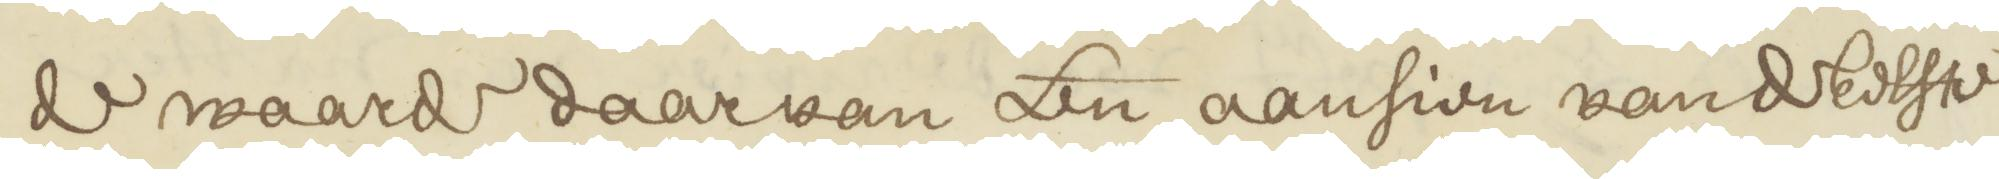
de waarde daarvan ten aansien van deselffe
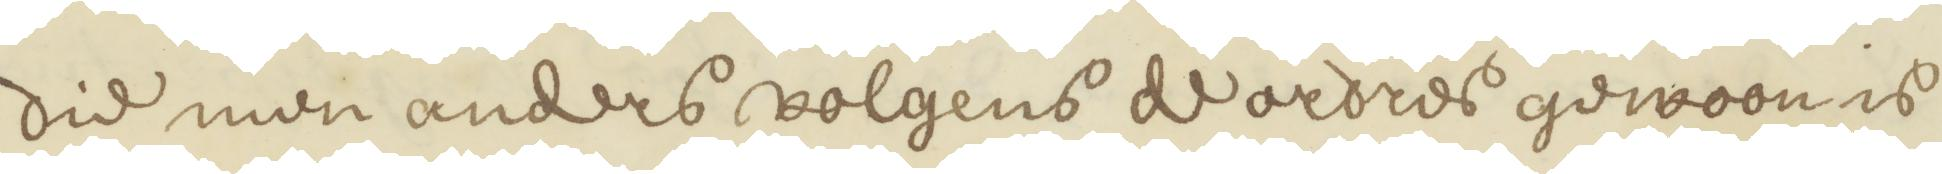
die men anders volgens de ordres gewoon is
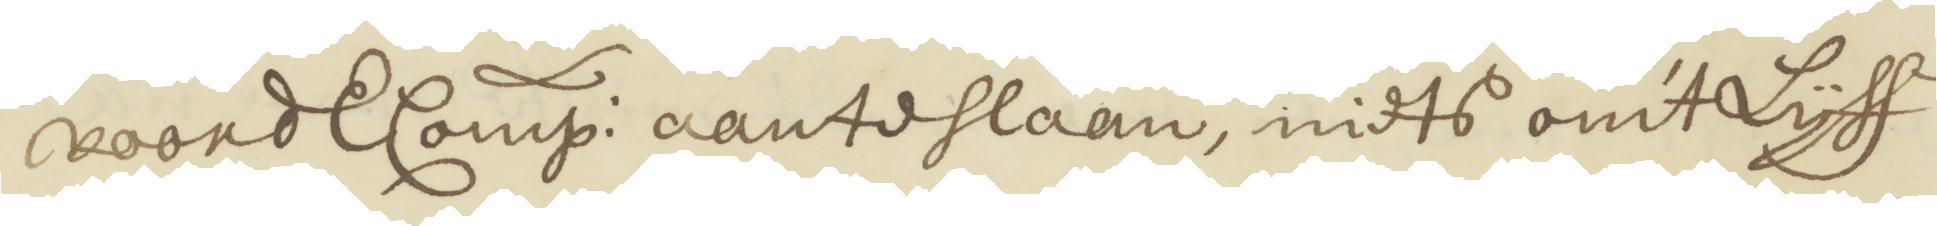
voor dEComp: aanteslaan, niets om ’t lijff
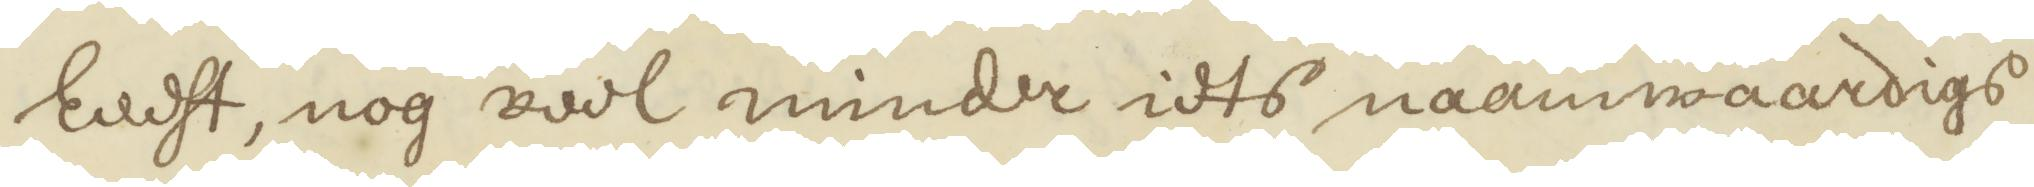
heeft, nog veel minder iets naamwaardigs
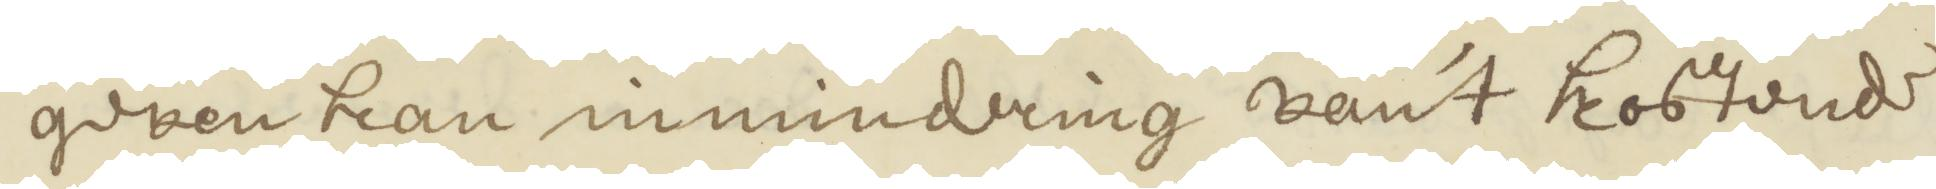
geven kan inmindering van ’t kostende
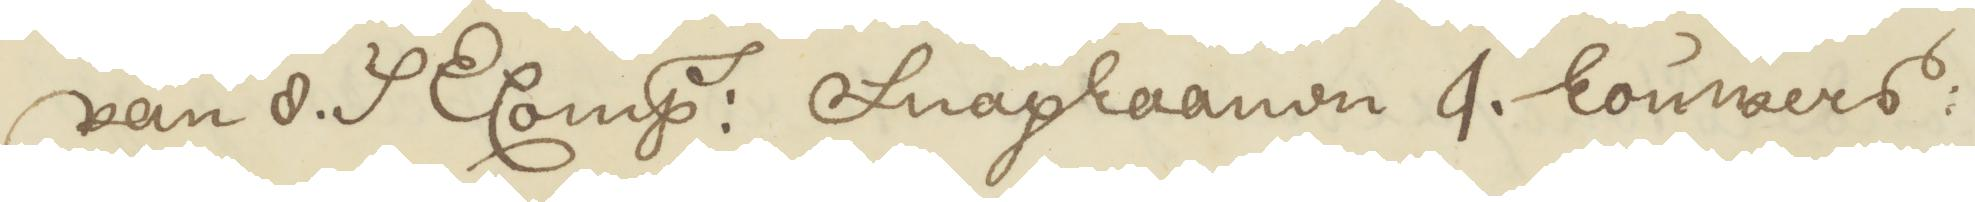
van 8. 'sEComp:s snaphaanen 4. houwers:
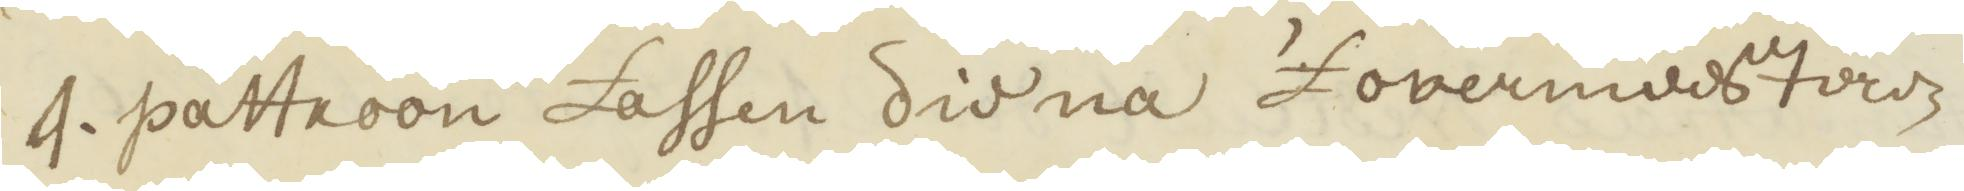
4. pattroon Lassen die na 't overmeesteren
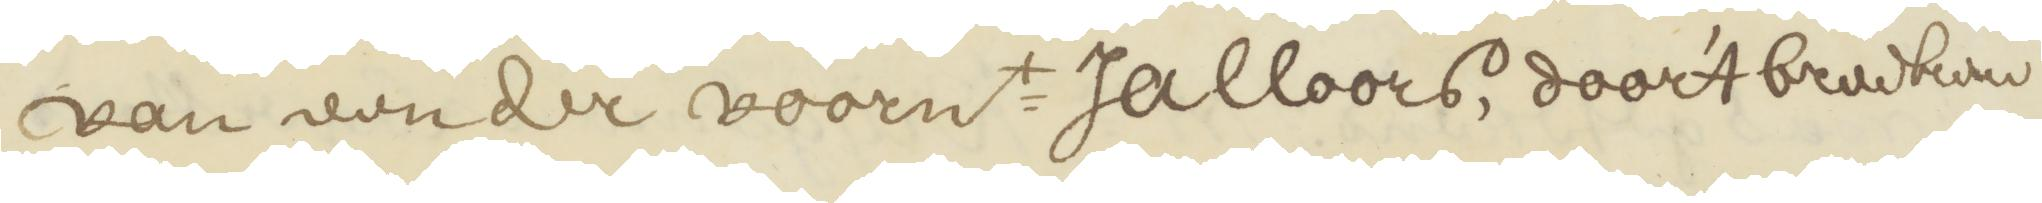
van een der voorn:t Jalloors, door ’t breeken
